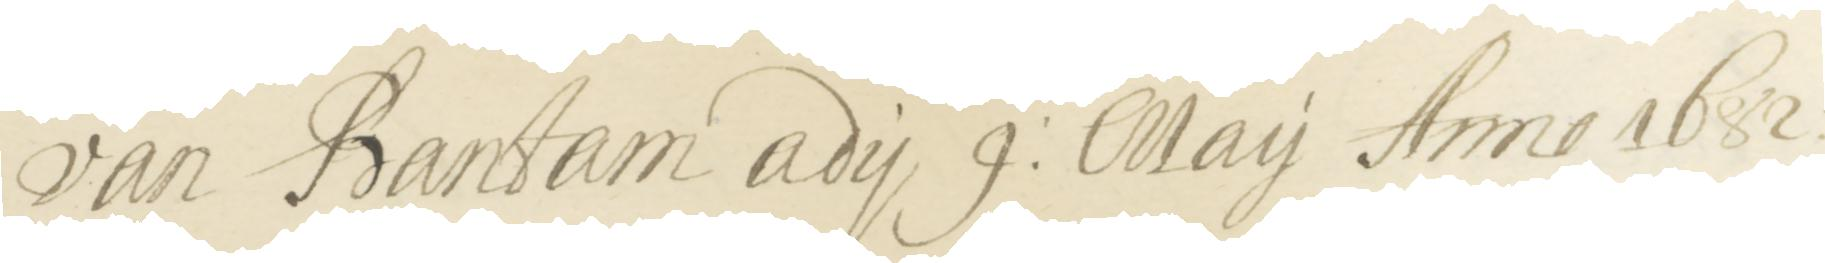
van Bantam adij 9: Maij Anno 1682
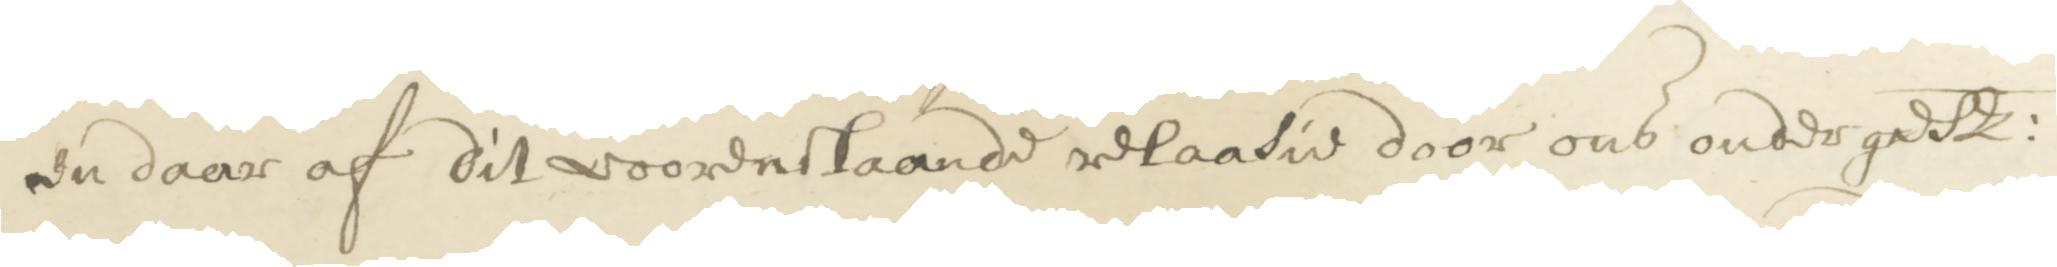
en daar af dit voorenstaande relaasie door ons onder gesz:
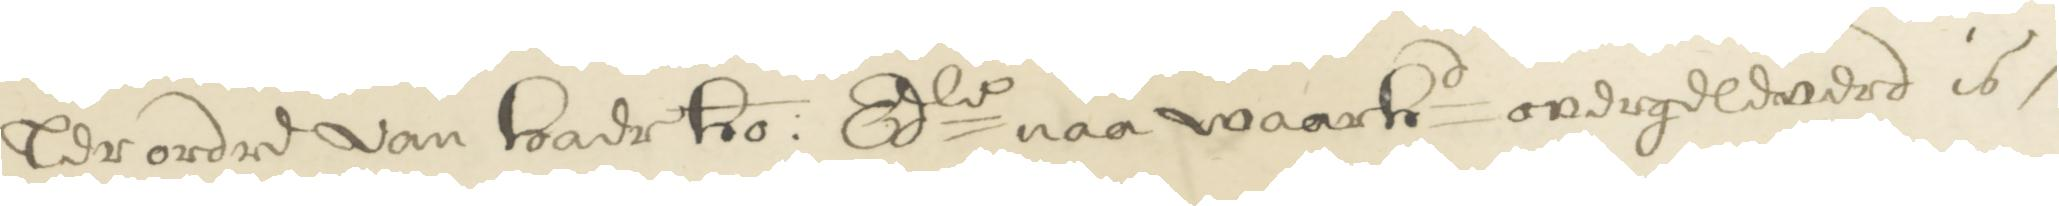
ter ordre van haer ho: Ed=le naa waarh=d overgeleverd is,
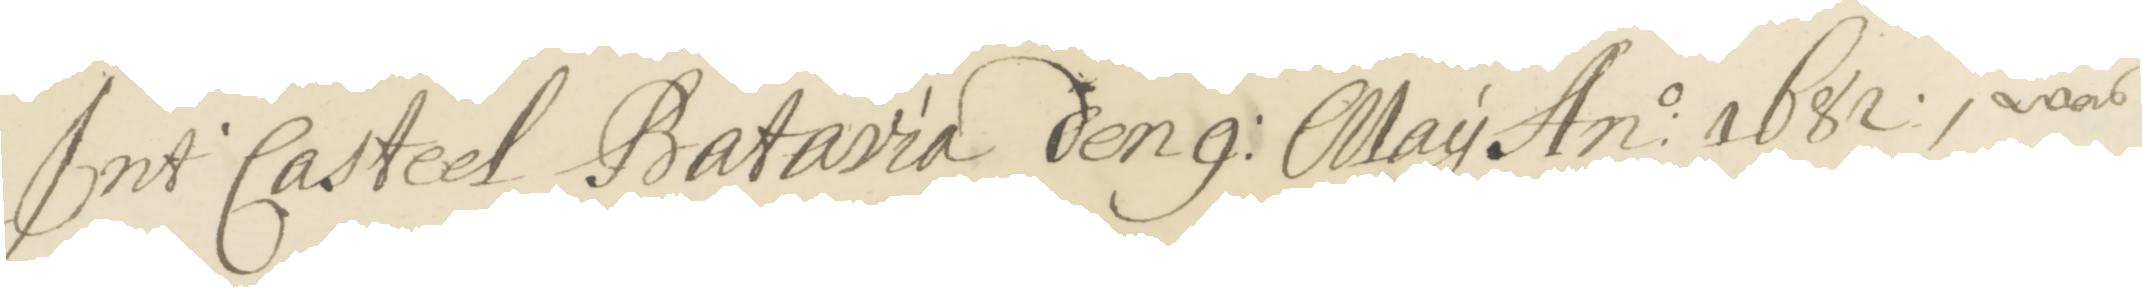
Int' Casteel Batavia den 9: Maij An:o 1682:, was
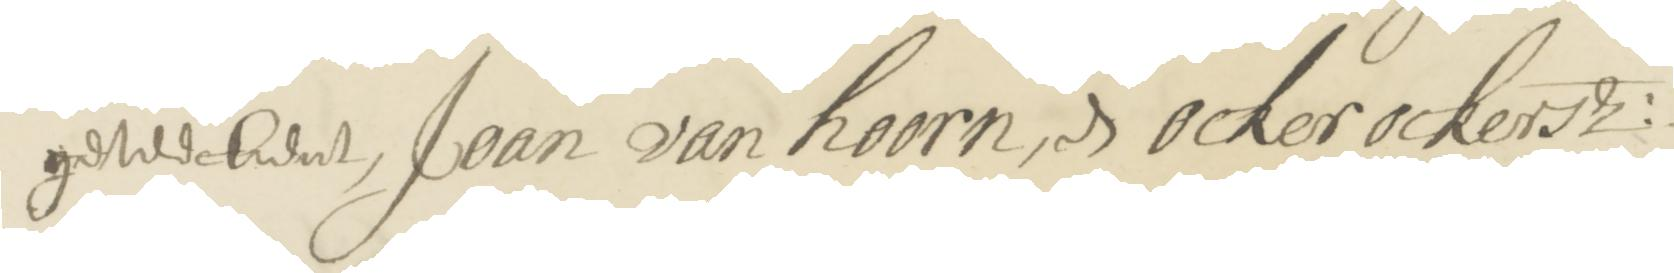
geteeckent, Joan van hoorn, en ocker ockersz:
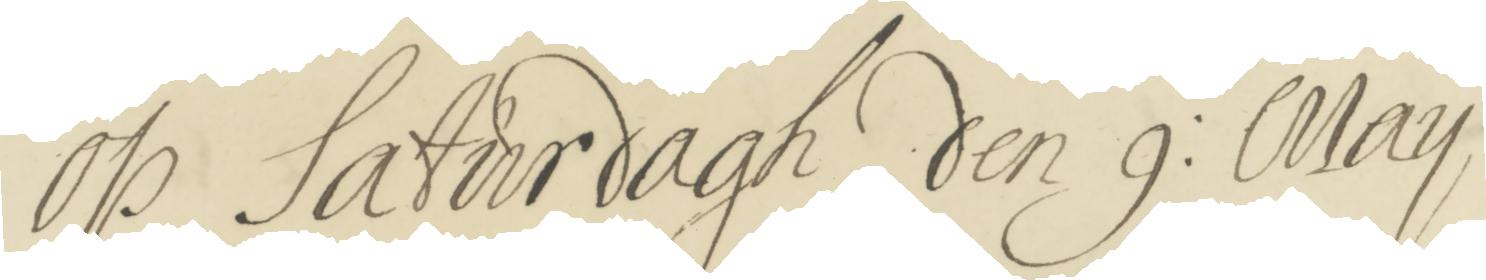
op Saturdagh den 9: Maij
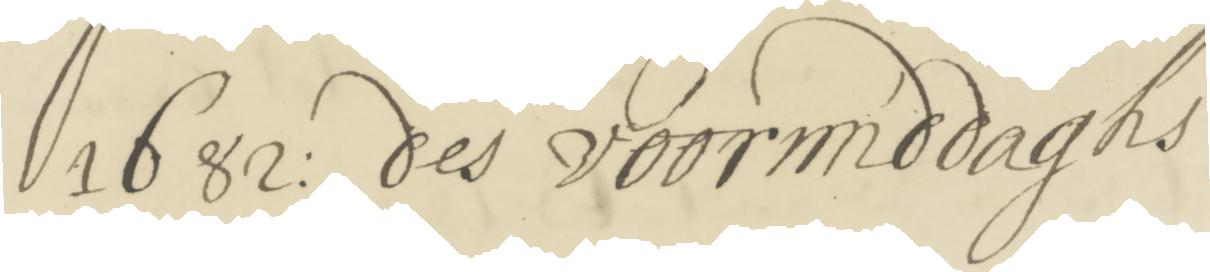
1682: des voormiddaghs
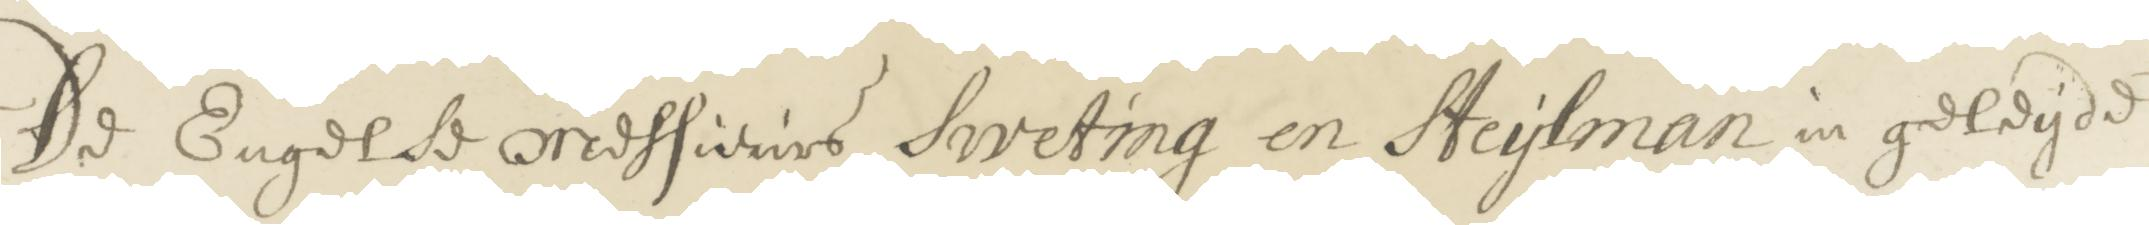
De Engelse messieurs Sweting en Steijlman in geleijde
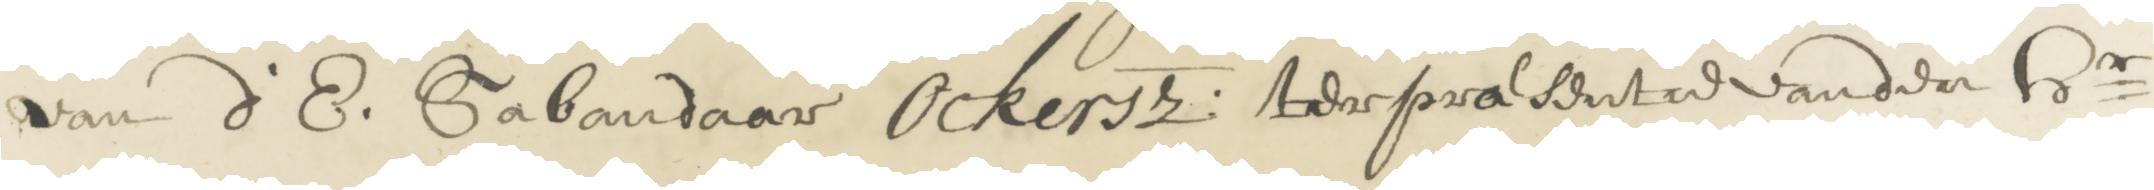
van d’E. Sabandaar Ockersz: ter praesentie van den h=r
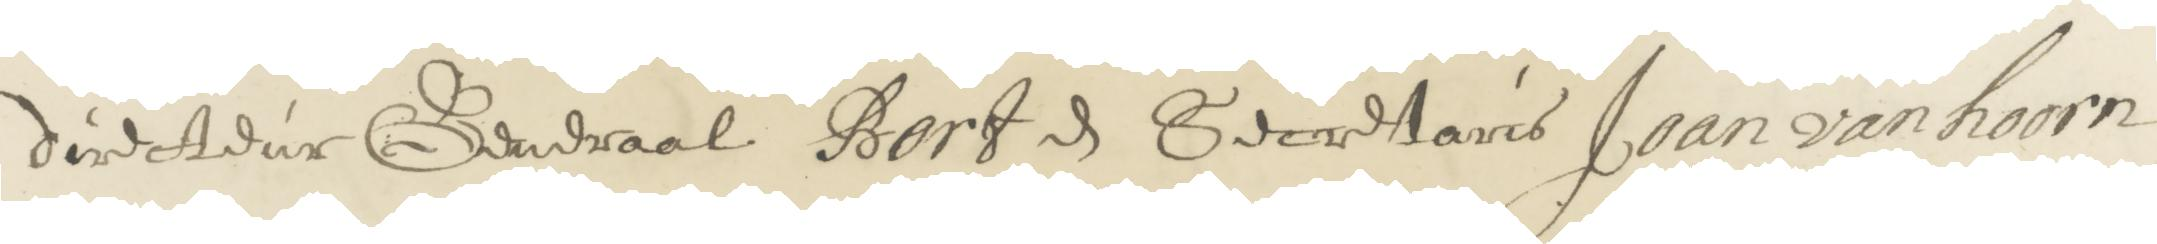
directeur Generaal Bort en Secretaris Joan van hoorn
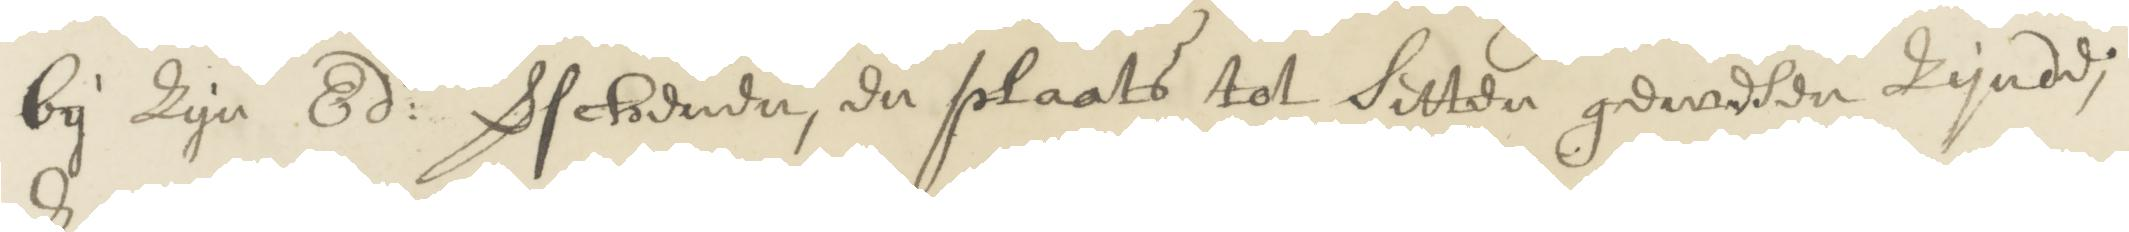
bij zijn Ed: verschenen, en plaats tot sitten gewesen zijnde,
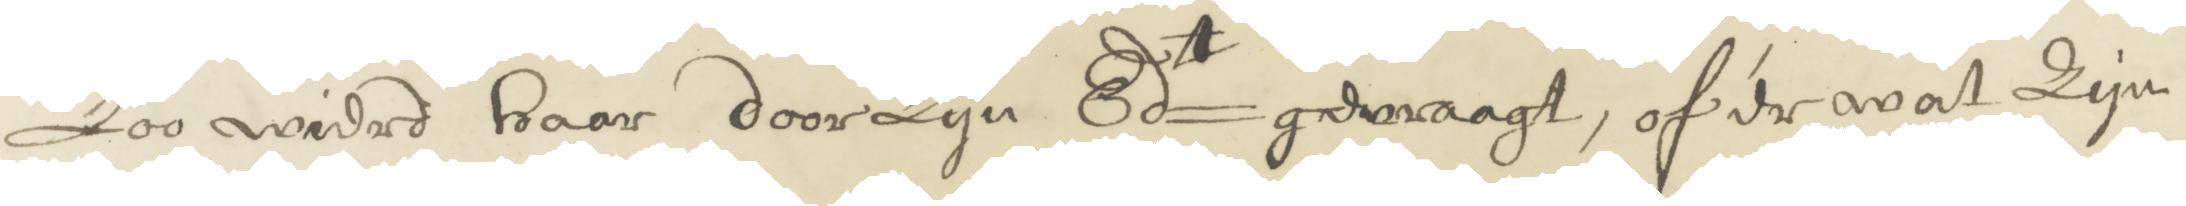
zoo wierd haar door zijn Ed=t gevraagt, of 'er wat zijn
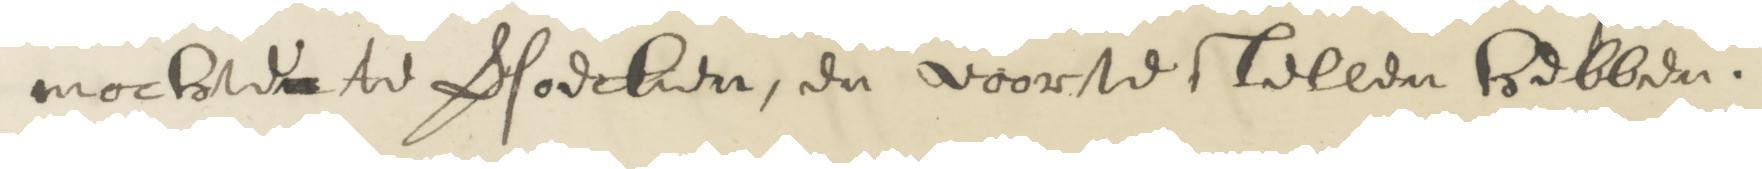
mochte te versoecken, en voorte stellen hebben.
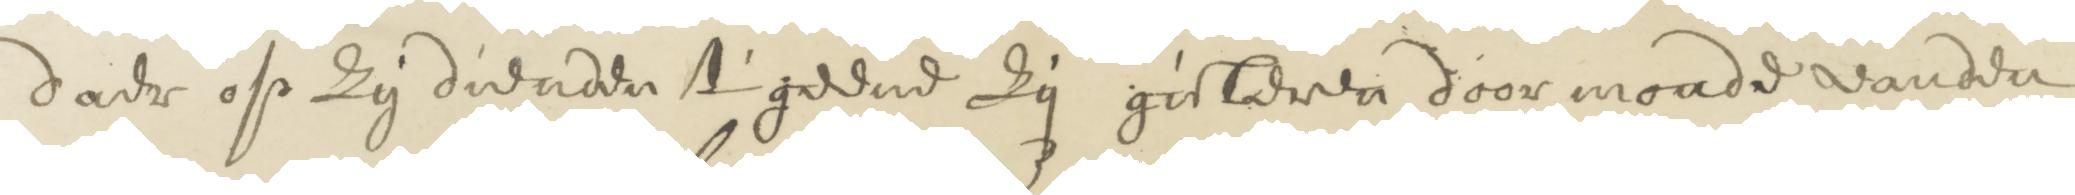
daer op zij dienden t' geene zij gisteren door monde vanden
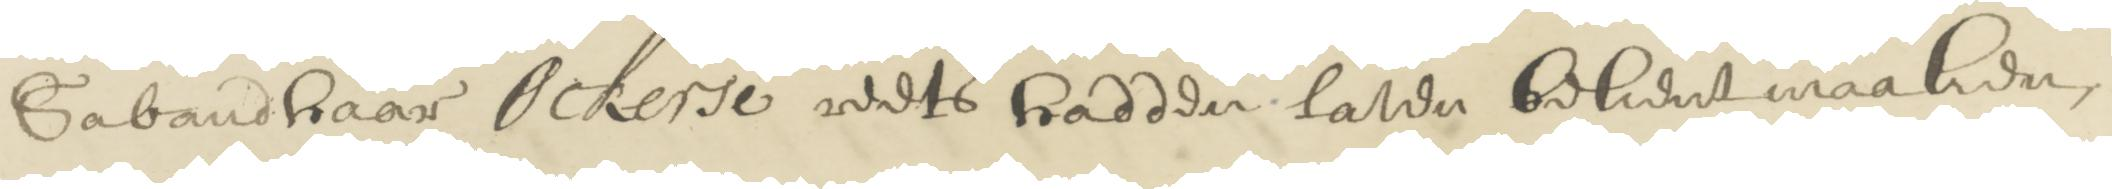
Sabandhaar Ockerse reets hadden laten bekentmaaken,
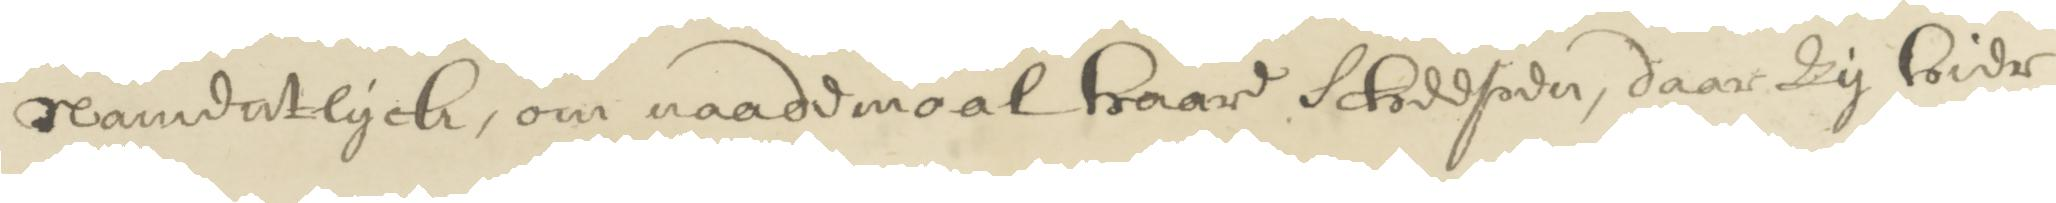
namentlijck, om naademaal haare scheepen, daar zij hier
